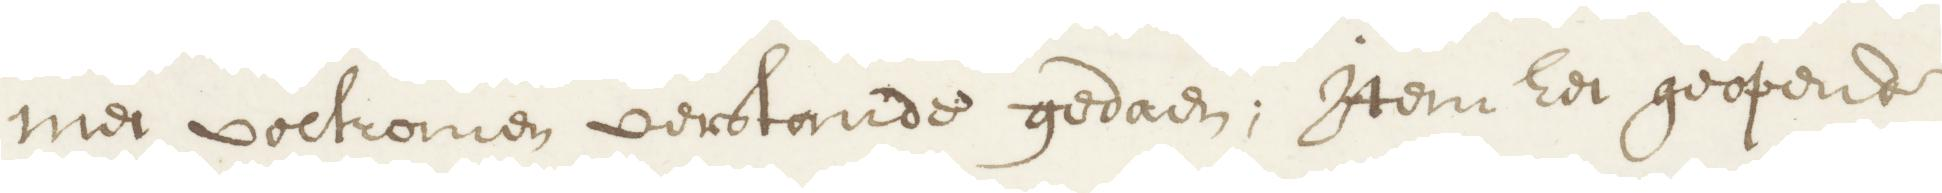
met volkomen verstande gedaen; jtem het geopende
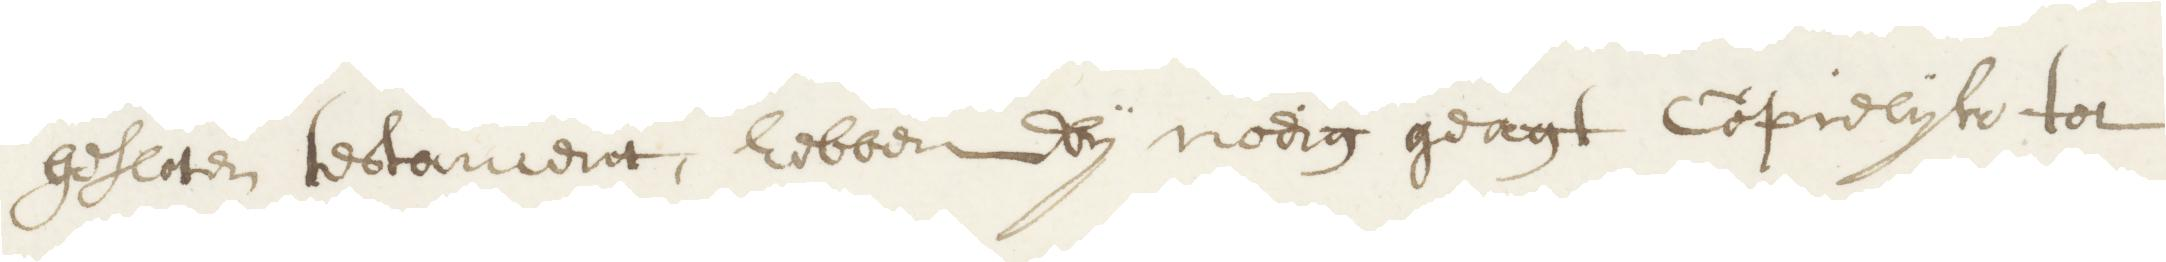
gesloten testament, hebben wij nodig geagt Copielijk tot
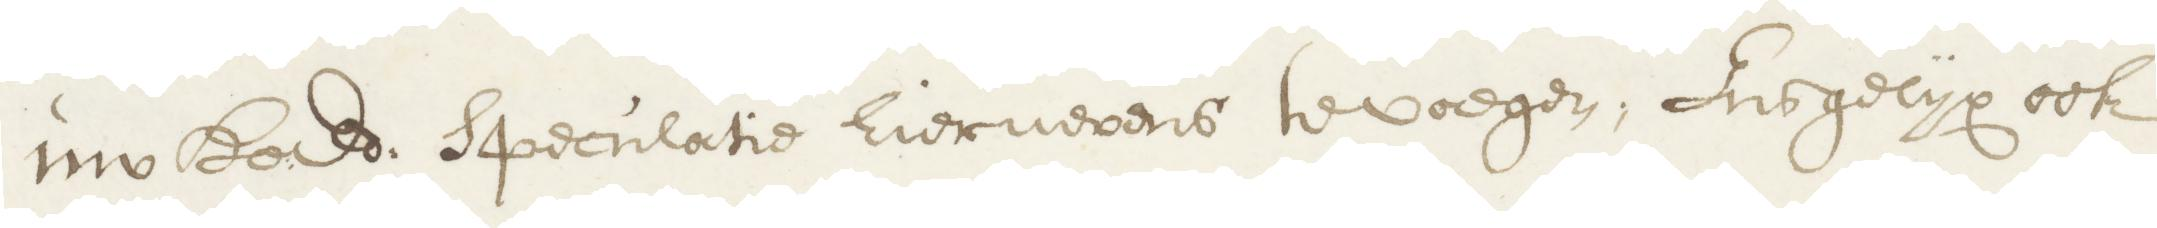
uw Ho:Ed: speculatie hier nevens te voegen; Insgelijx ook
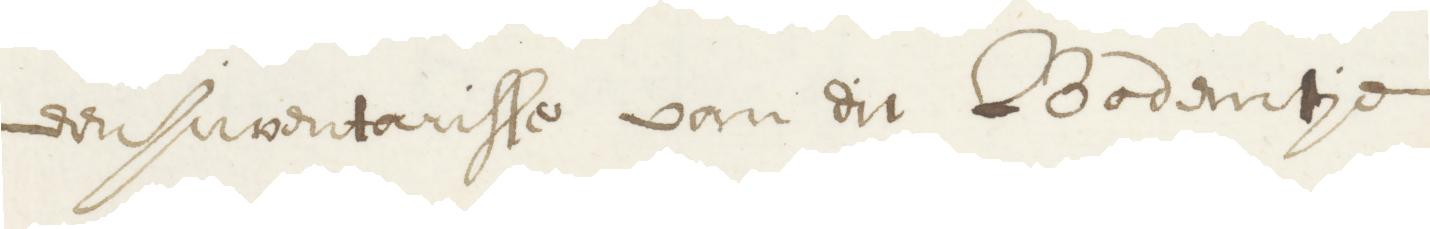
een jnventarisse van dit Bodemtje
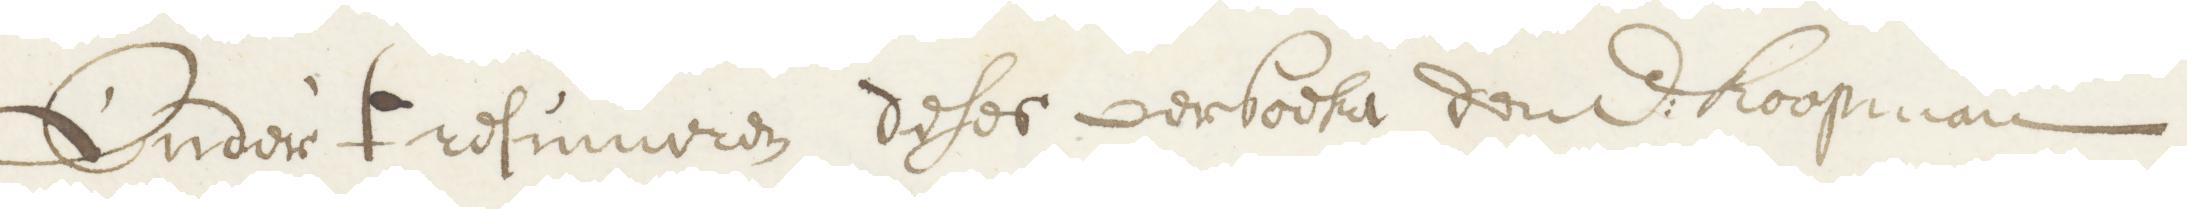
Onder ’t resumeren deses versoekt den E: koopman
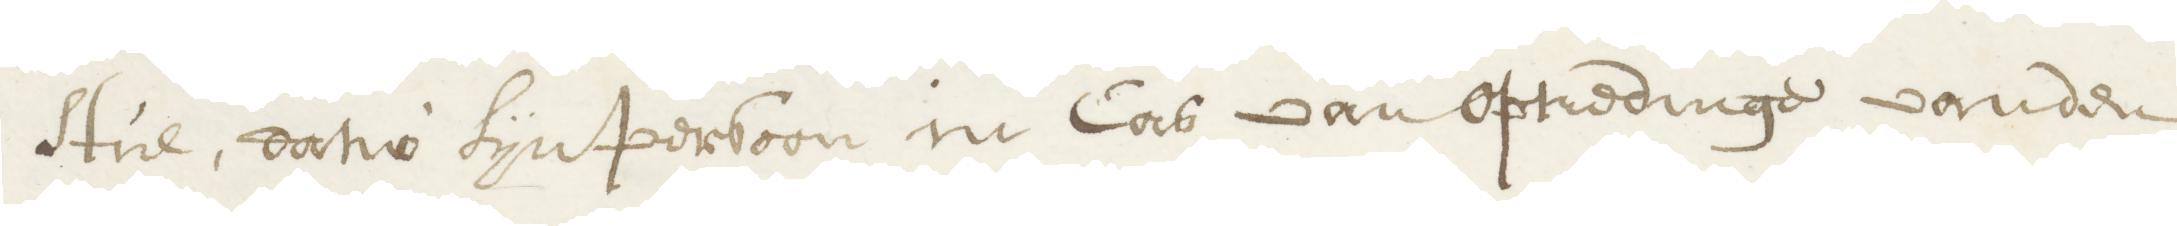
stul, datw' sijn persoon in Cas van optredinge vanden
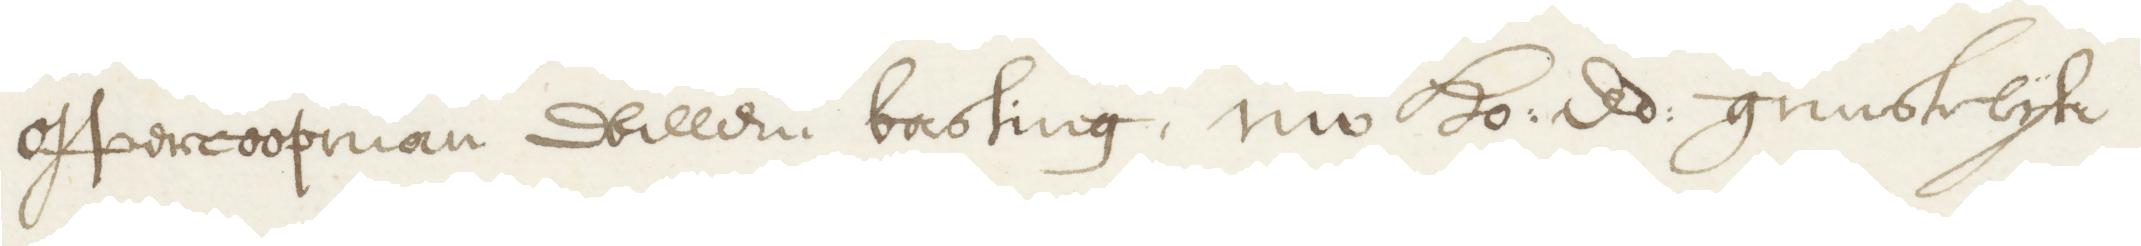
oppercoopman willem bassing, uw Ho:Ed: gunstelijk
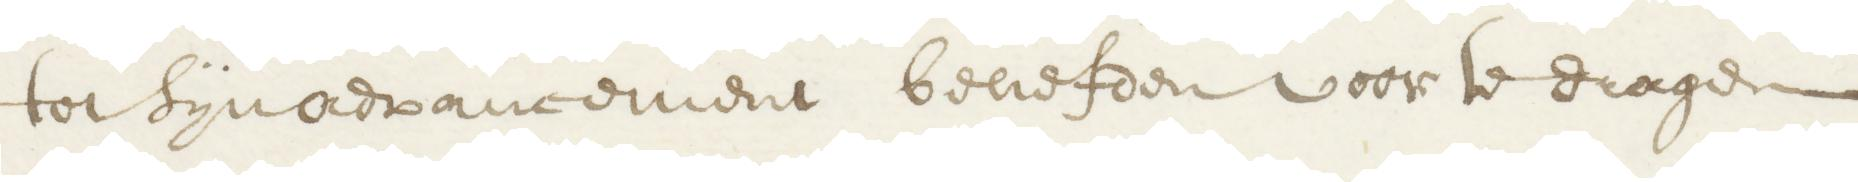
tot sijn advancement beliefden voor te dragen
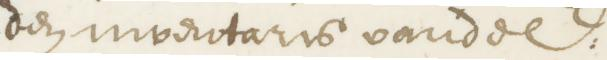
den inventaris van de E:
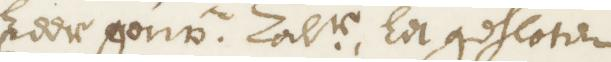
heer gouv.r zal.r, het gesloten
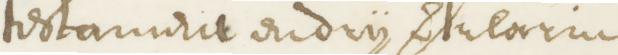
testament en drij verklarin
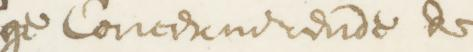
ge Concernerende de
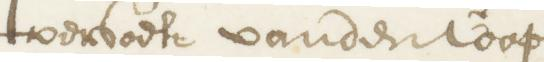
t versoek van den Coop
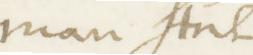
man stul
